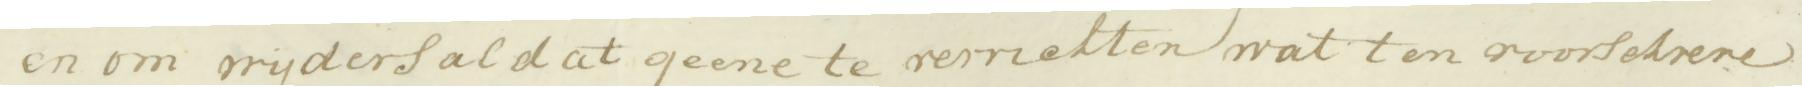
en om wijders al dat geene te verrichten wat ten voorschreve
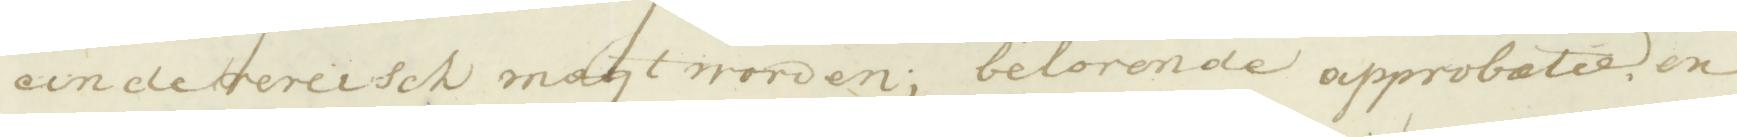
einde vereisch mogt worden; belovende approbatie, en
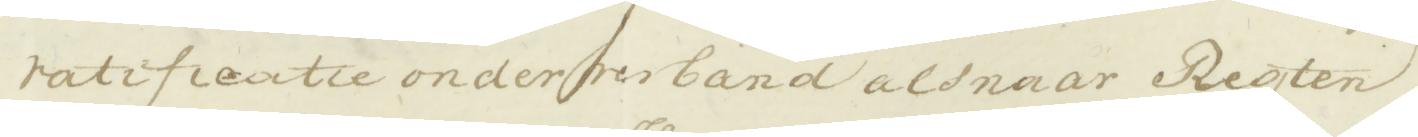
ratificatie onder verband als naar Regten
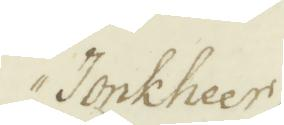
„ Jonkheer
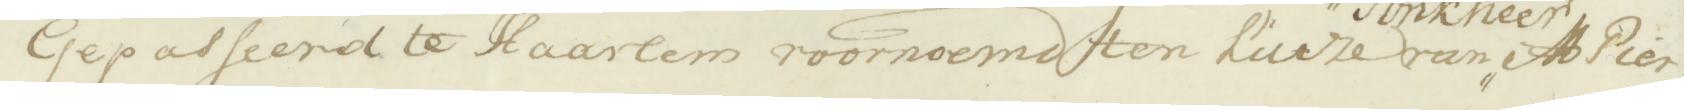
Gepasseerd te Haarlem voornoemd ten huize van „ M Pier
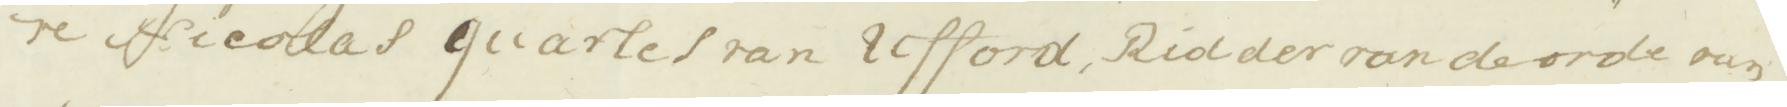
re Nicolas quarles van ufford, Ridder van de orde van
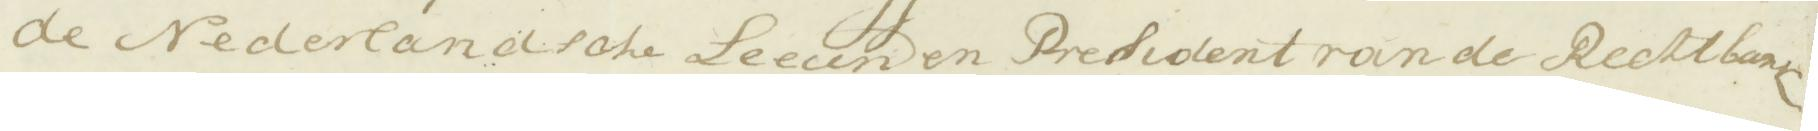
de Nederlandsche Leeuw en President van de Rechtbank
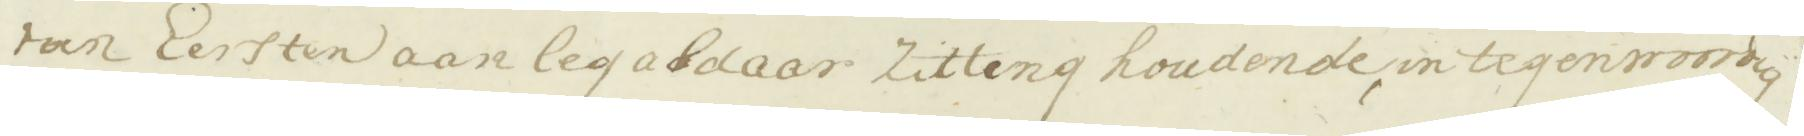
van Eersten aanleg aldaar zitting houdende, in tegenwoordig.
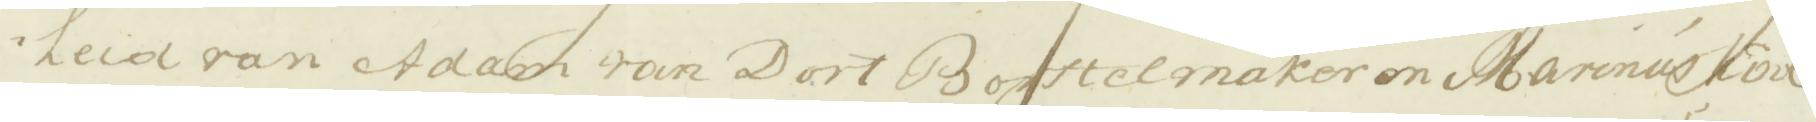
heid van Adam van Dort Borstelmaker en Marinus Kool
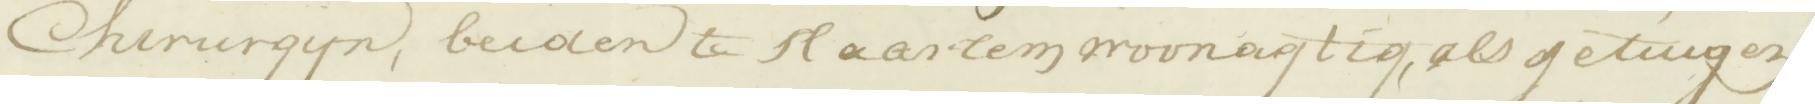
Chirurgyn, beiden te Haarlem woonagtig, als getuigen
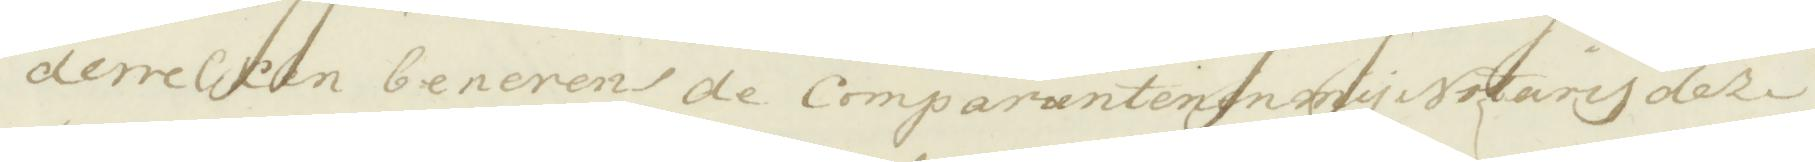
dewelken benevens de Comparanten en mij Notaris deze
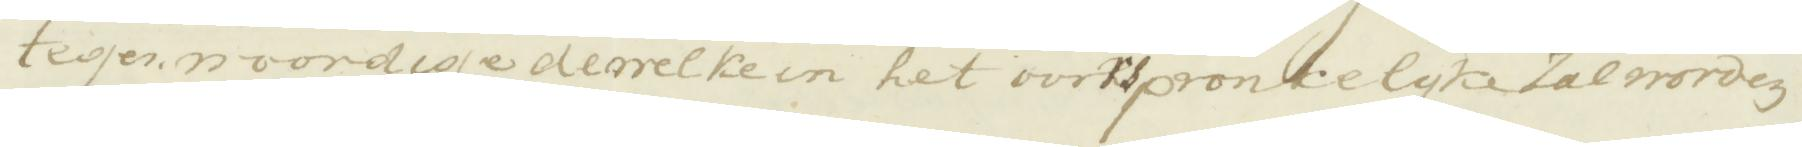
tegenwoordige dewelke in het oorspronkelyke zal worden
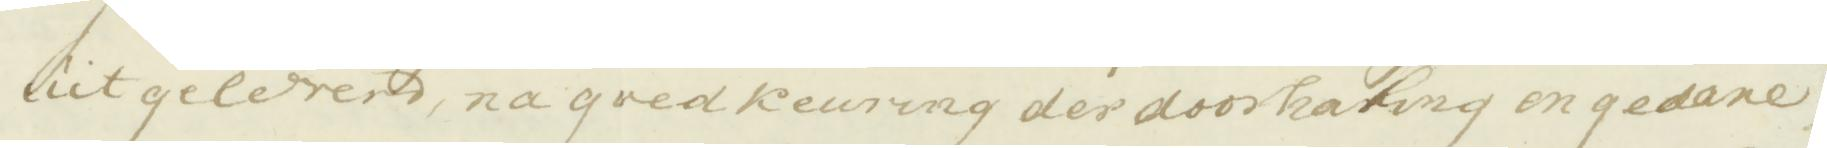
uitgeleverd, na goed keuring der doorhaling en gedane
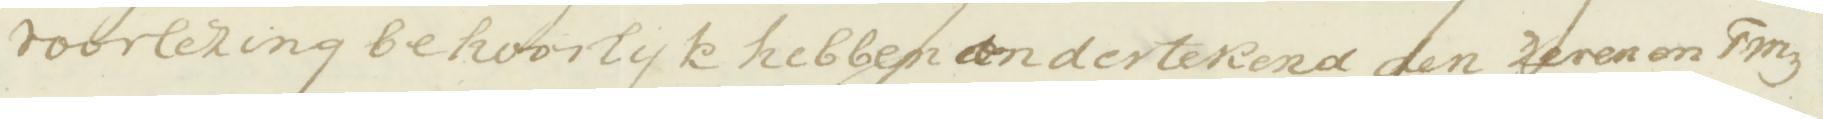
voorlezing behoorlyk hebben ondertekend den zeven en Twin
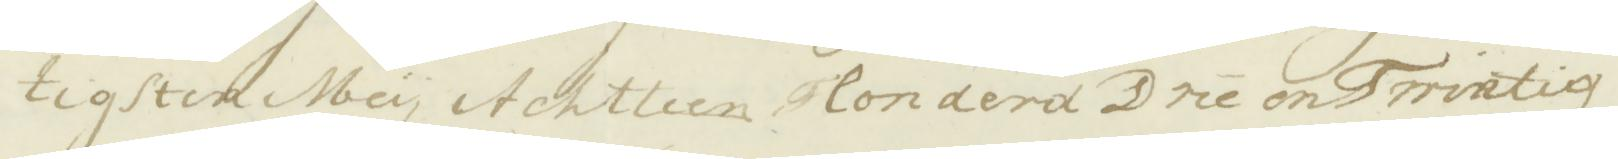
tigsten Meij Achttien Honderd Drie en Twintig.
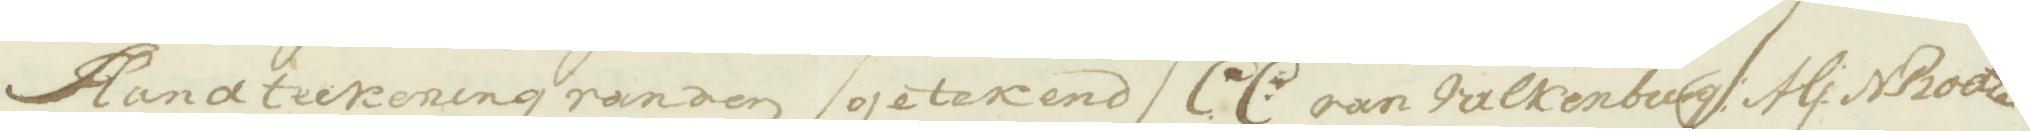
Handteekening van den /getekend / CC van valkenburg: AG: N Roden
